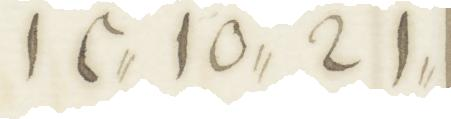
15„ 10„ 21„
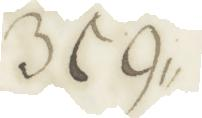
359„
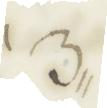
53„
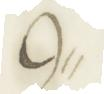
9„
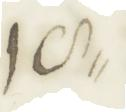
18„
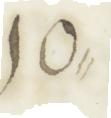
10„
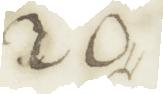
20„
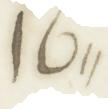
16„
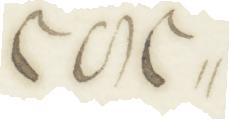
585„
